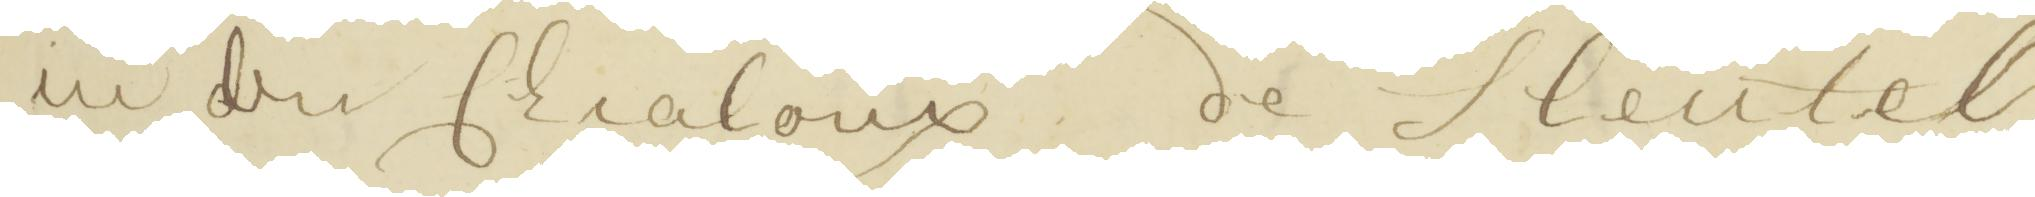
in den Chialoup de Sleutel
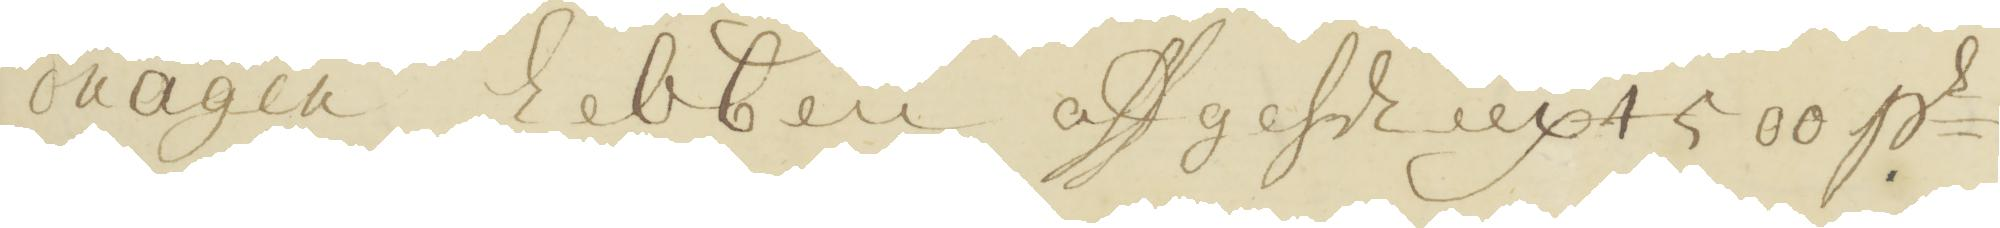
drager hebben affgescheept 500 p=s
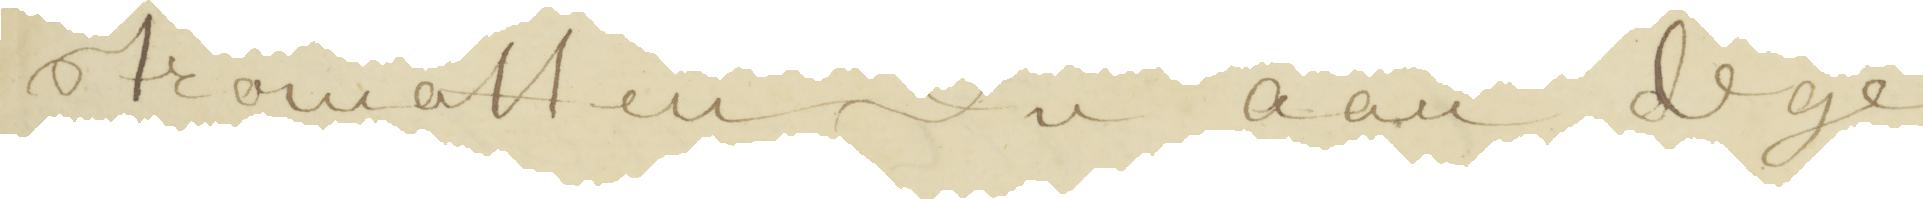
stromatten En aan de ge
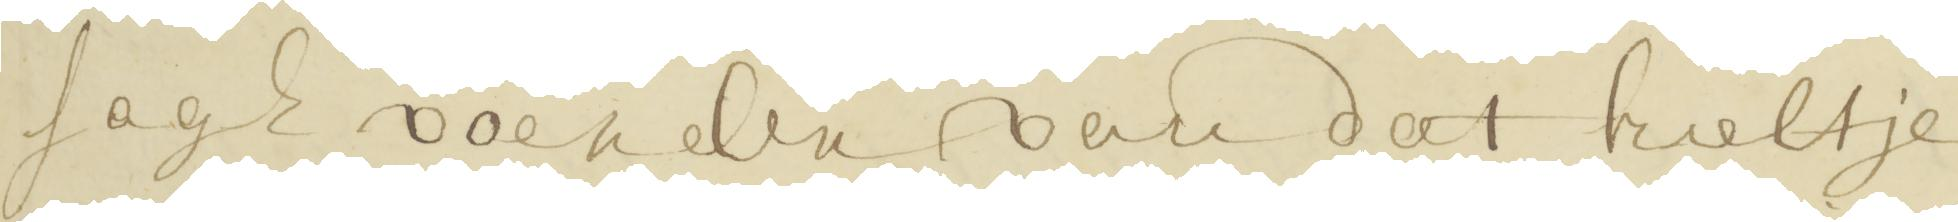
sagh voerder van dat kieltje
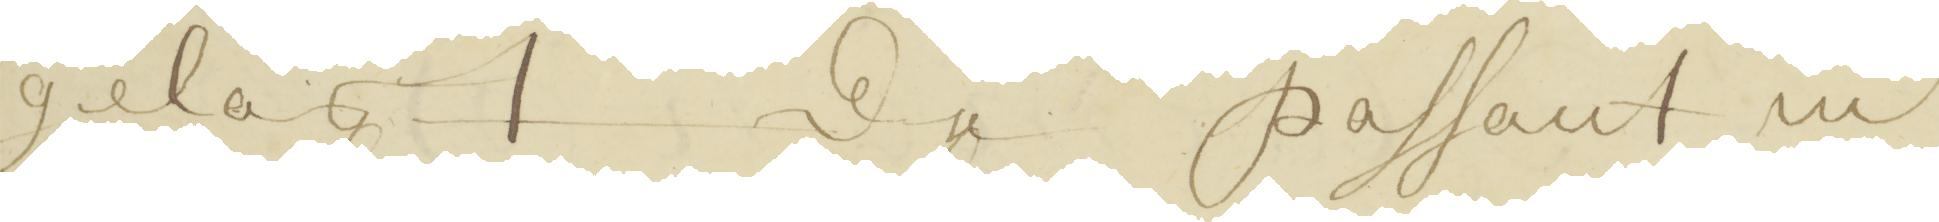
gelast er passant in
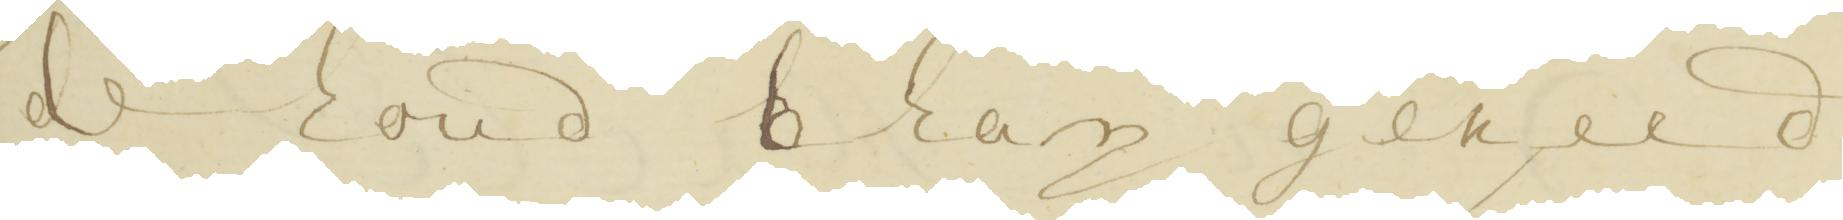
de houd bhay gereed
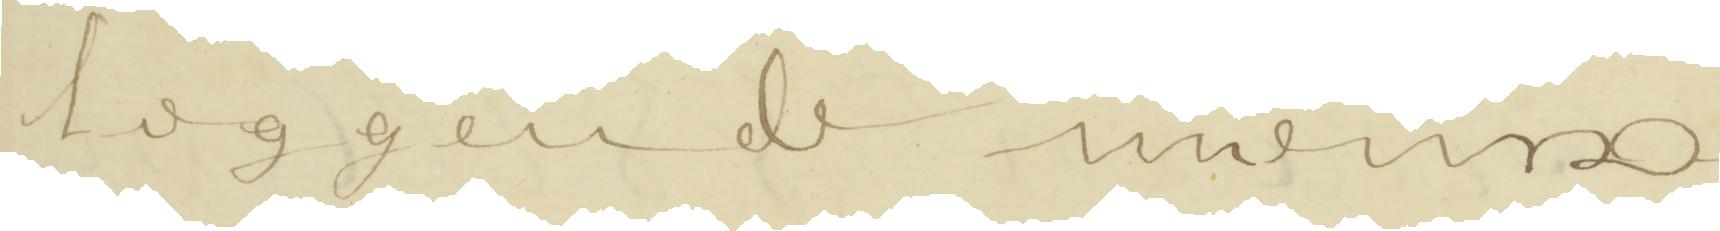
leggen de nieuwe
